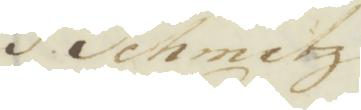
P. Schmitz
